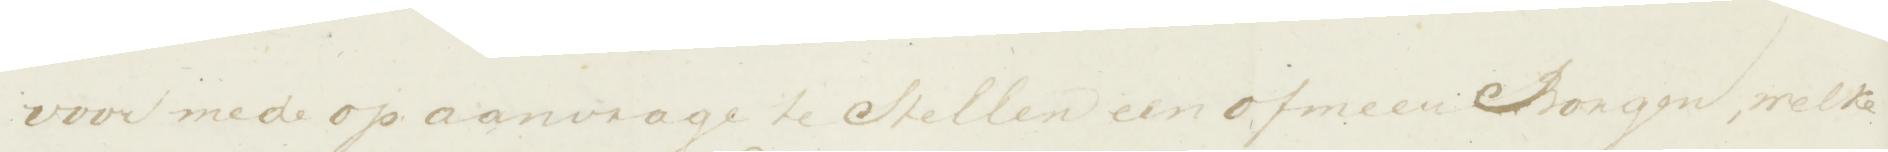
voor mede op aanvrage te stellen een of meer Borgen, welke
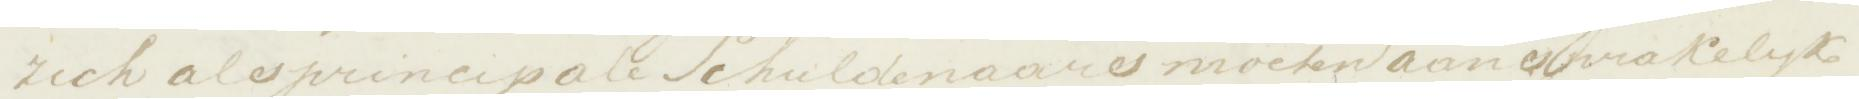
zich als principale Schuldenaars moeten aansprakelyk
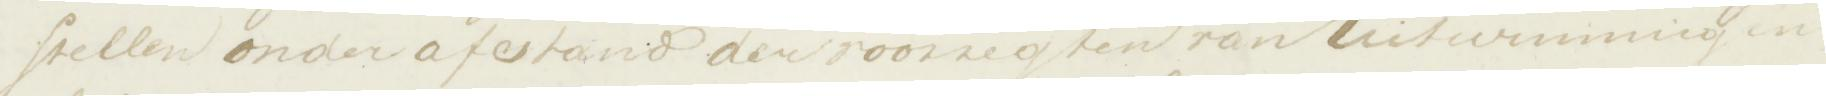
stellen onder afstand der voorregten van uitwinnig en
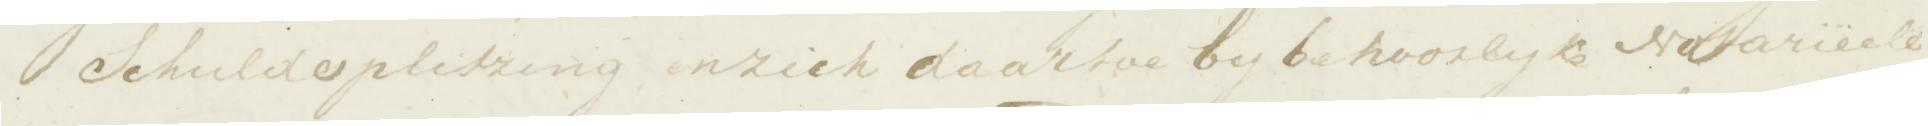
schuldsplitzing en zich daartoe by behoorlyk Notariëele
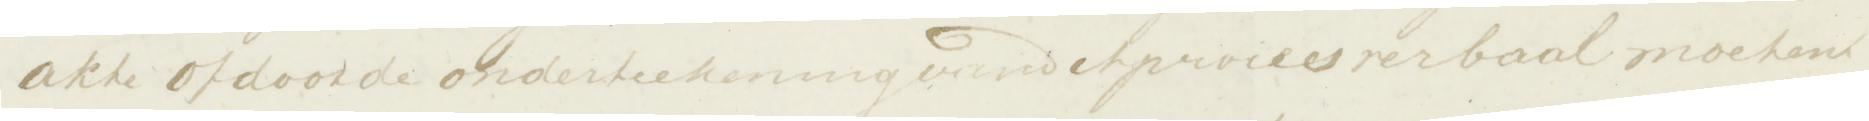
akte of door de onderteekening van dit proces verbaal moeten
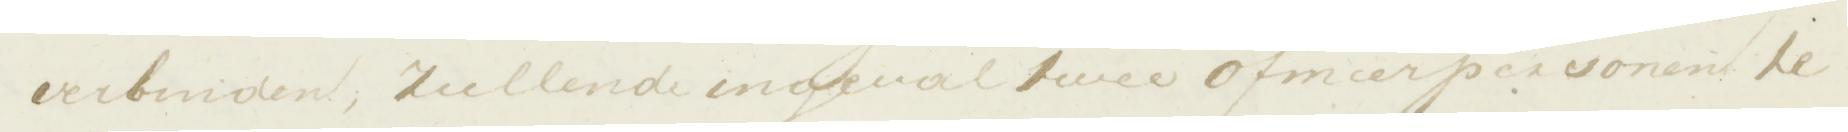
verbinden; zullende ingeval twee of meer personen te
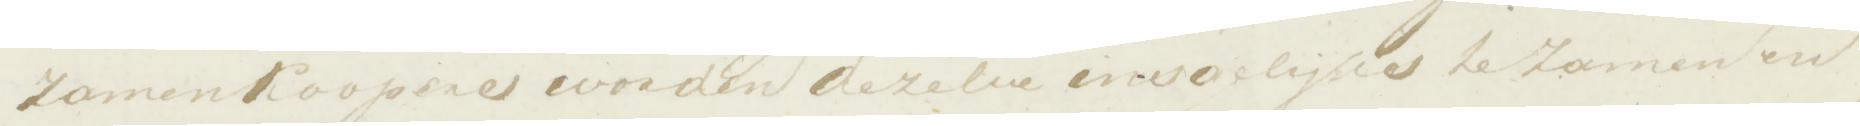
zamen koopers worden dezelve insgelijks tezamen en
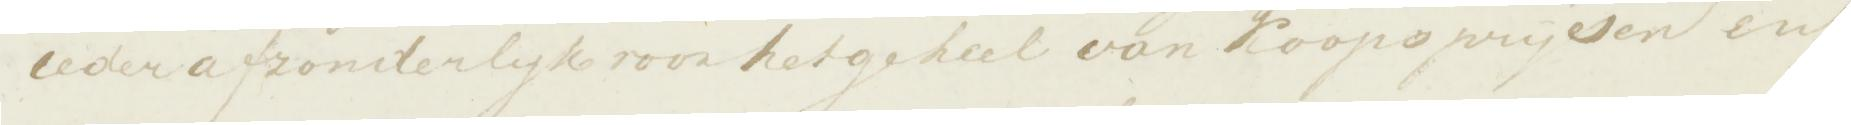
ieder afzonderlyk voor het geheel van Koopsprijsen en
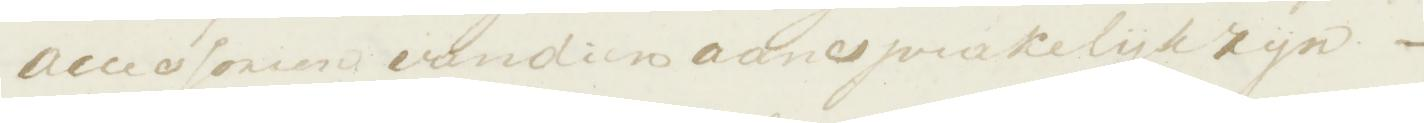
accessorien vandien aansprakelijk zijn. -
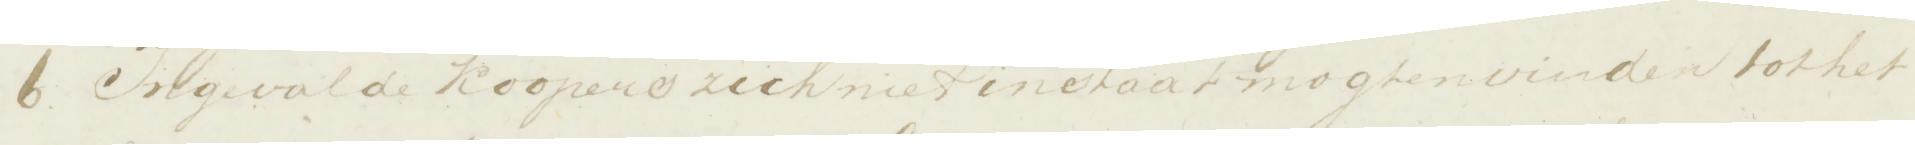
6 Ingeval de koopers zich niet in staat mogten vinden tot het
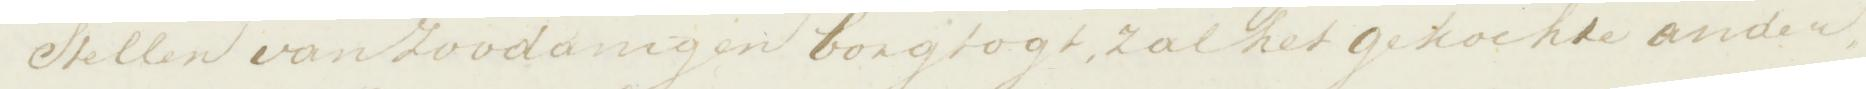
stellen van zoodanigen borgtogt, zal het gekochte ander,
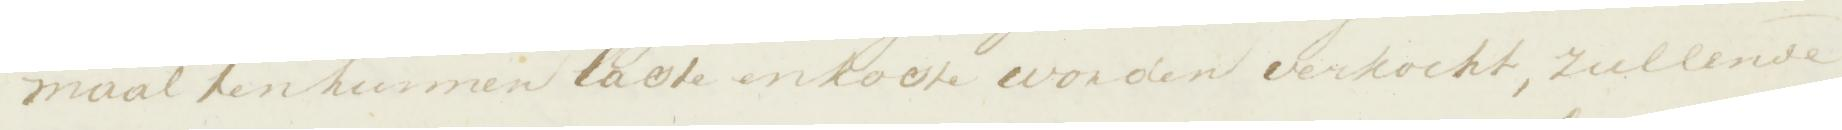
maal ten hunnen laste en koste worden verkocht, zullende
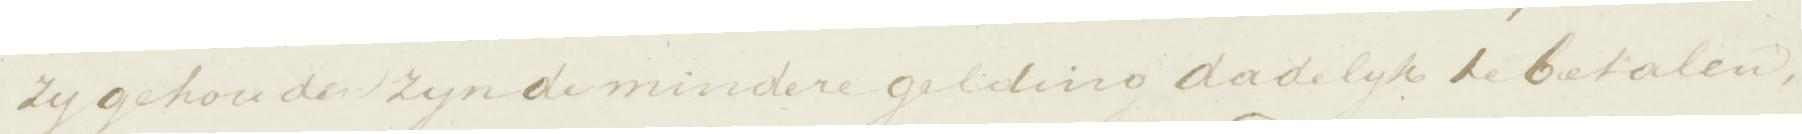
zy gehouden zyn de mindere gelding dadelyk te betalen,
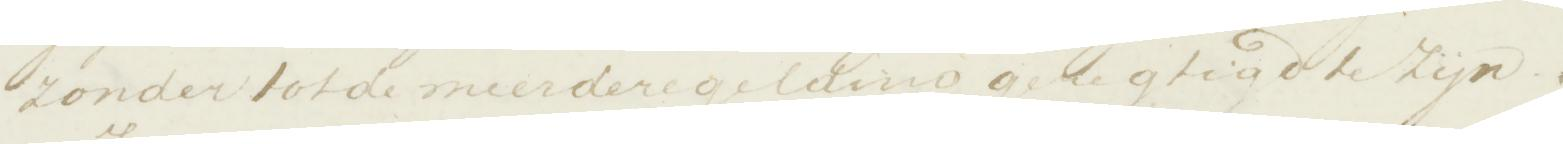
zonder tot de meerdere gelding geregtigd te zijn.
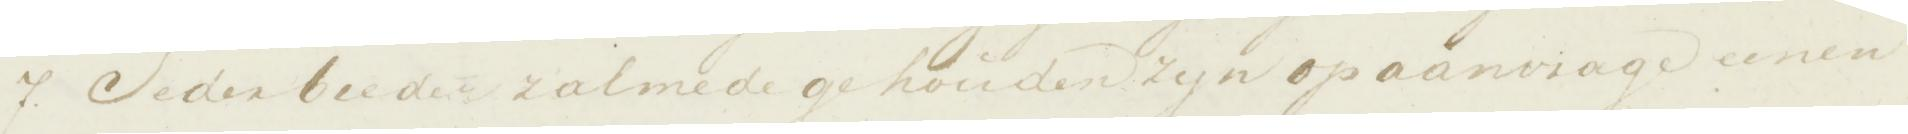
7. Ieder bieder zal mede gehouden zyn op aanvrage eenen
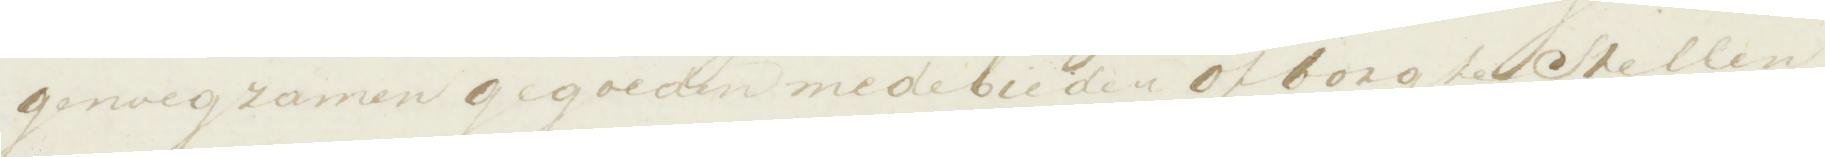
genoegzamen gegoeden medebieder of borg te stellen
